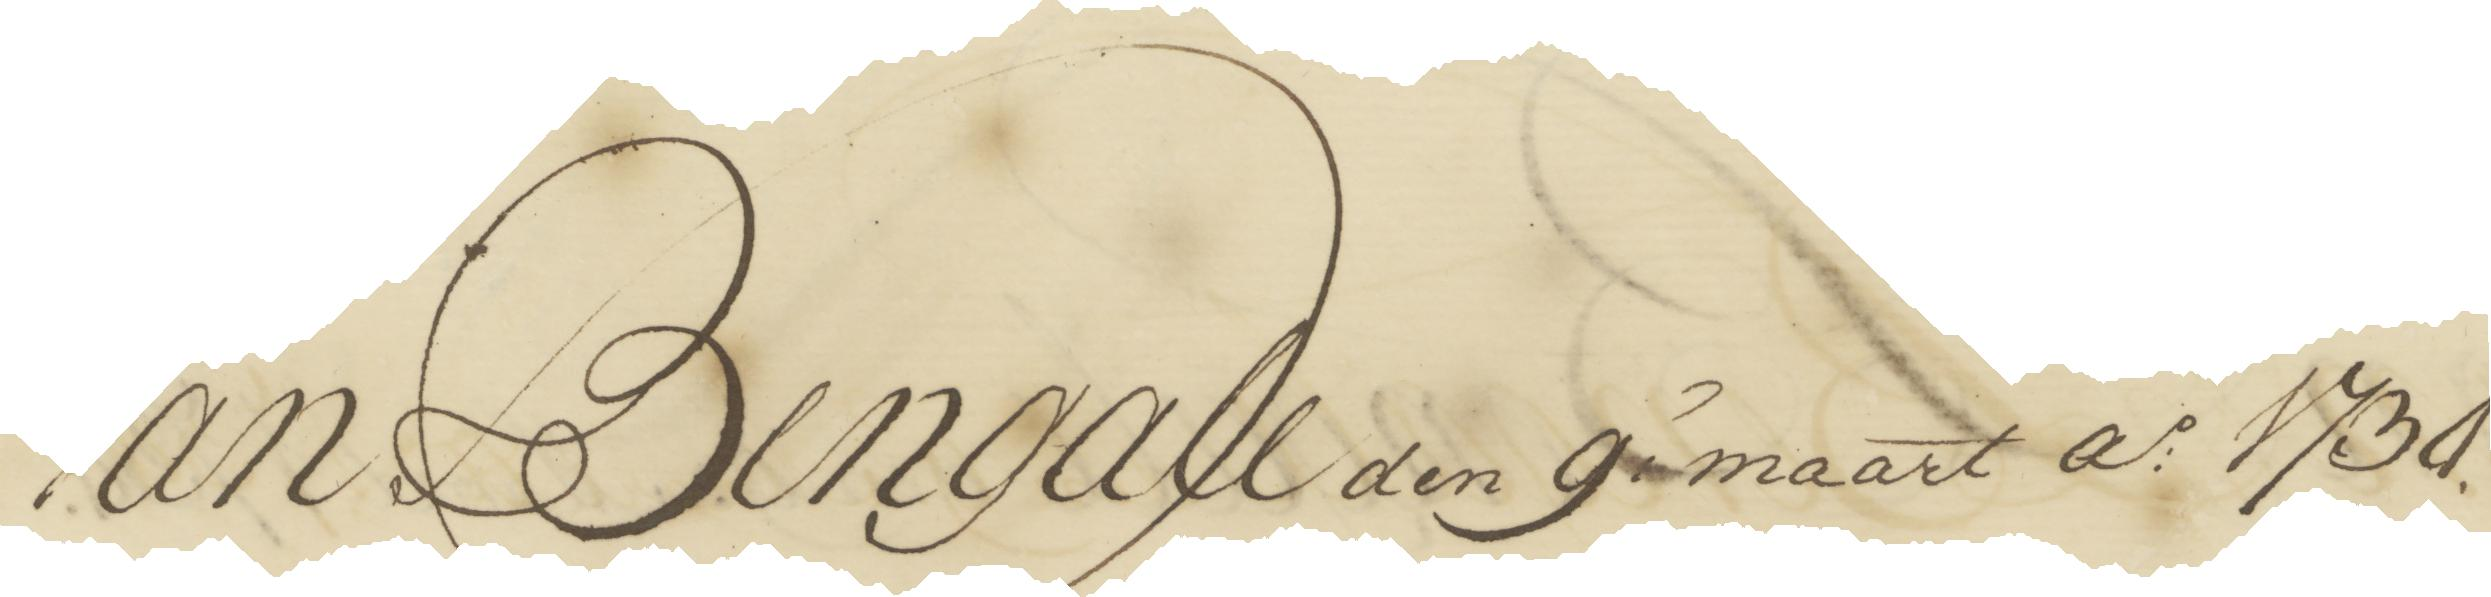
Van Bengale den 9.' maart a:o 1734.
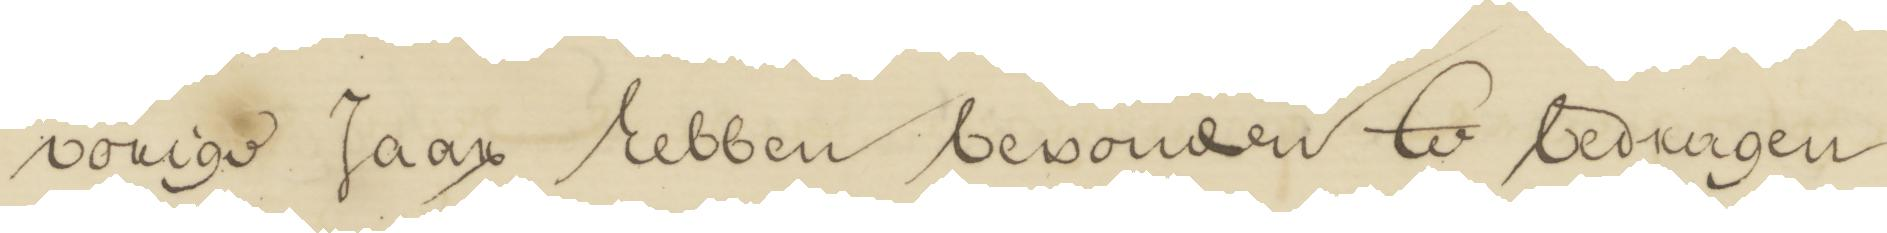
vorige Jaar hebben bevonden te bedragen
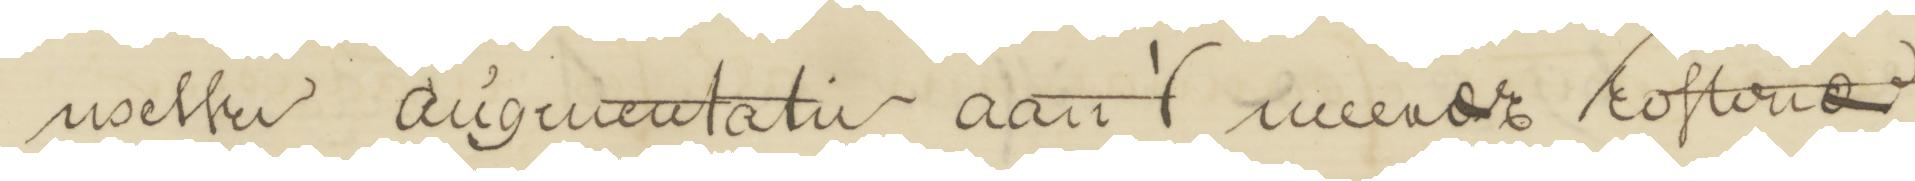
welke augmentatie aan ’t meerder kostende
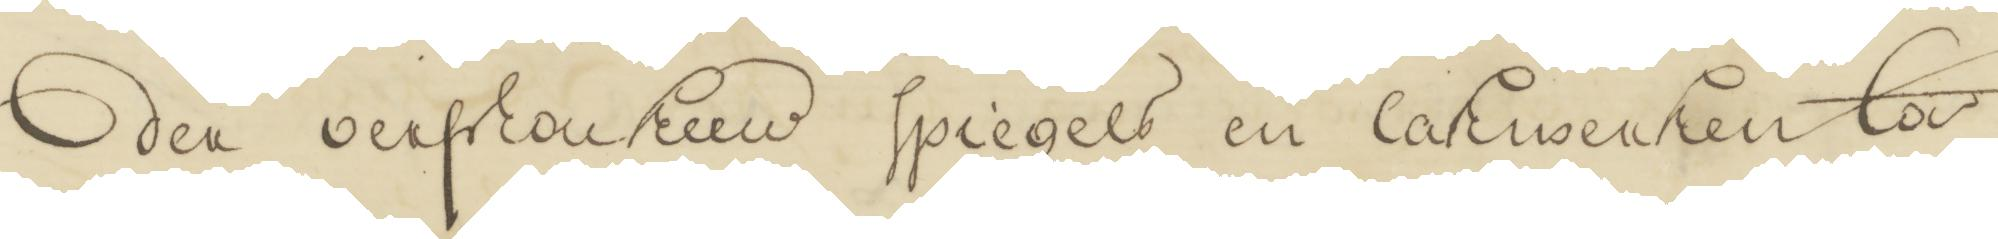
der verschonkene spiegels en lakwerken toe
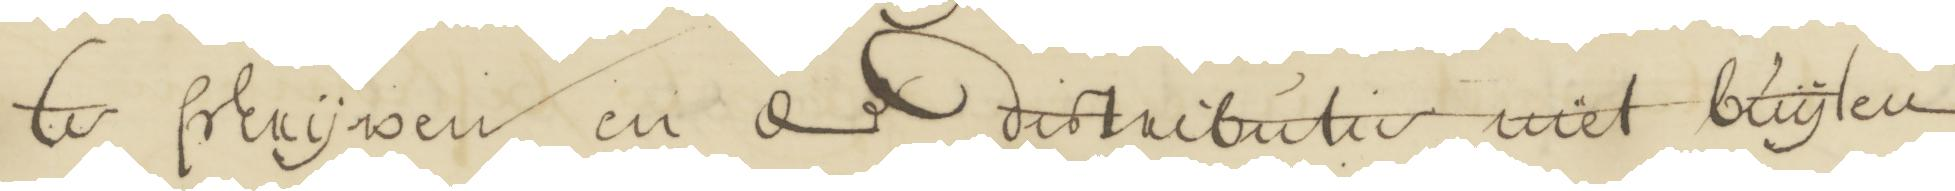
te schrijven en de distributie niet buijten
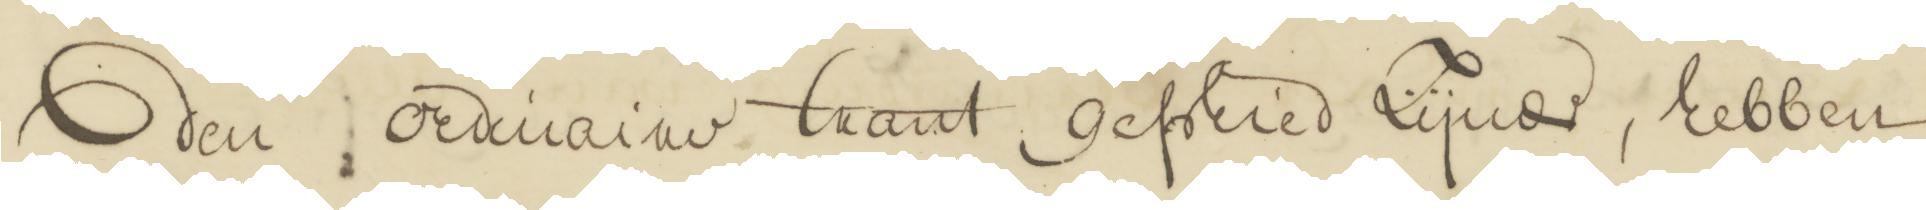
den ordinaire trant geschied Zijnde, hebben
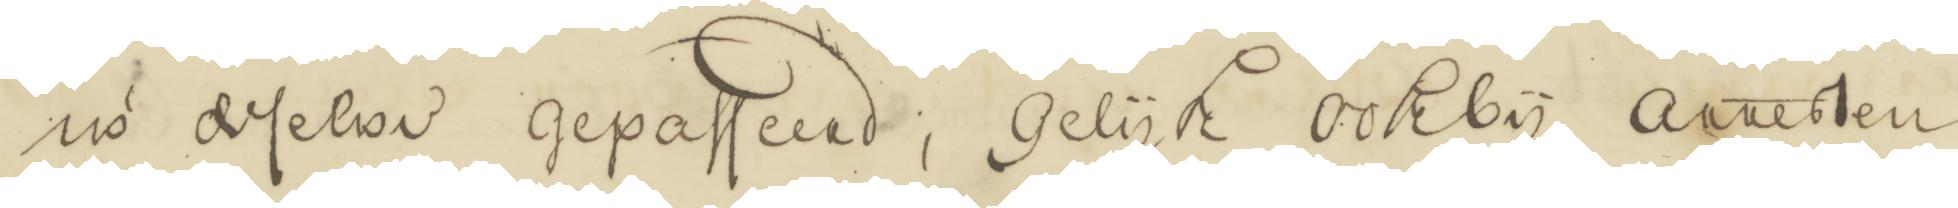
w' deselve gepasseerd; gelijk ook bij arresten
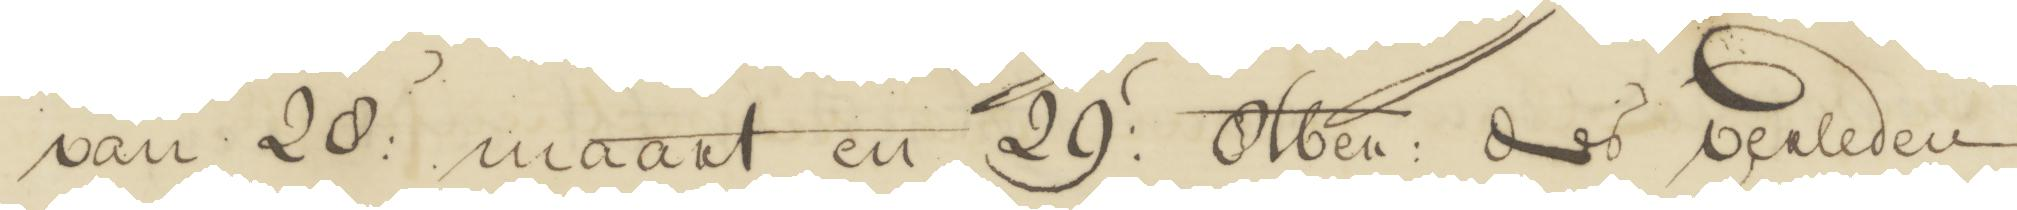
van 28:' maart en 29:' 8ber: des verleden
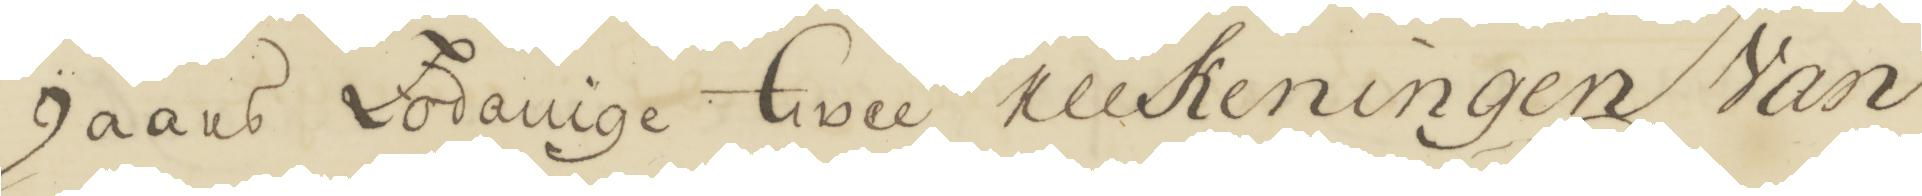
Jaars Zodanige twee reekeningen Van
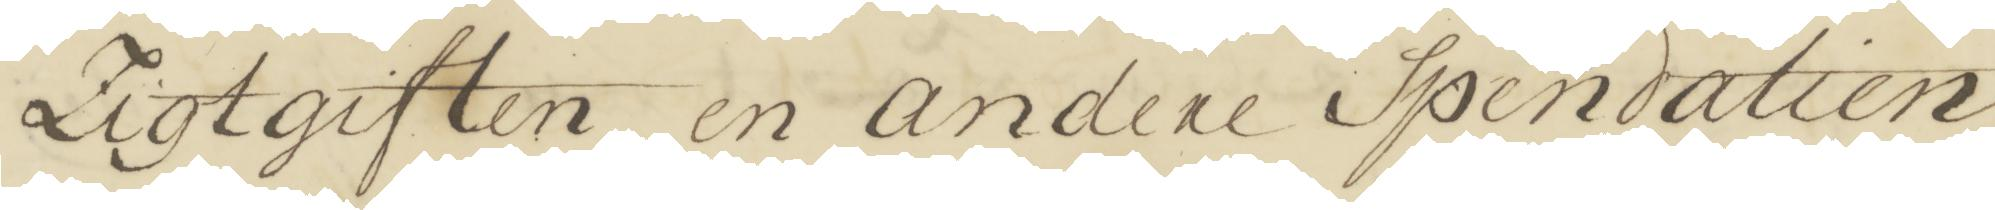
Zigtgiften en andere Spendatien
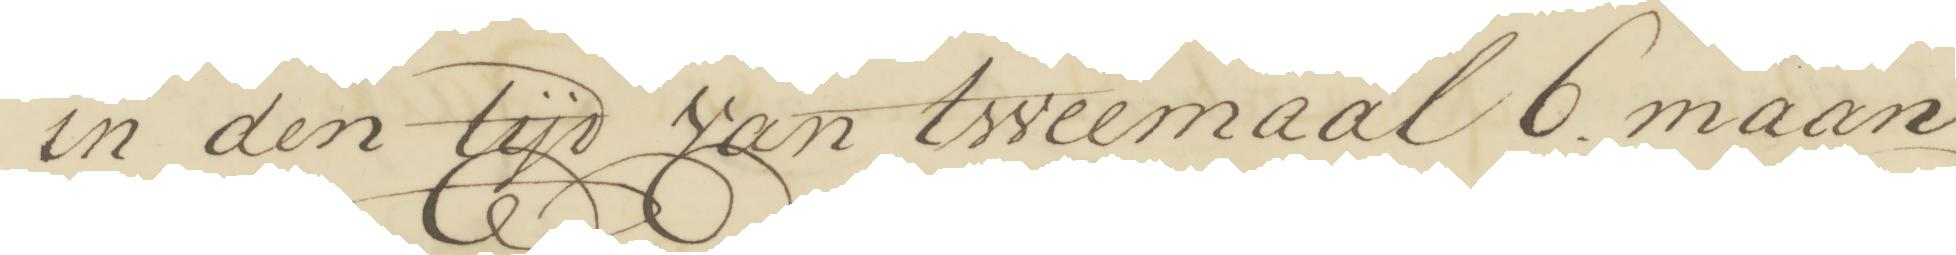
in den tijd van tweemaal 6. maan
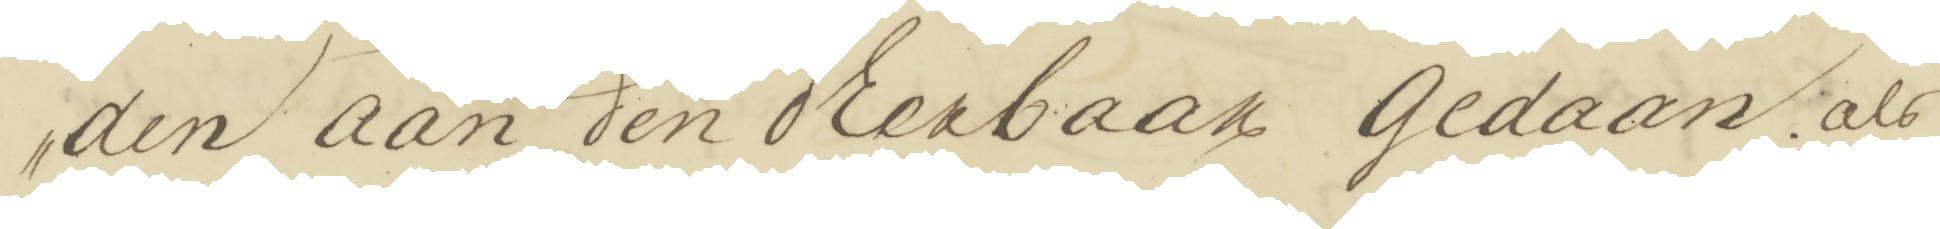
„den aan den d Eerbaar gedaan, als
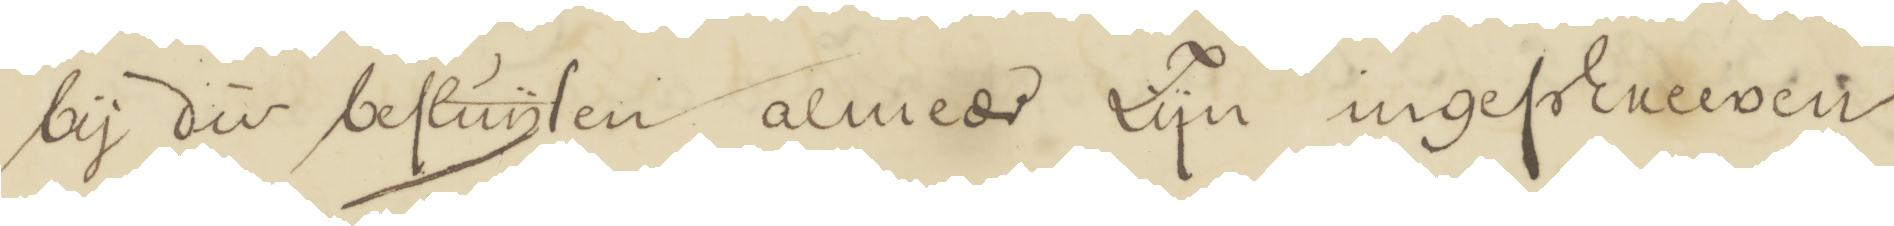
bij die besluijten almede Zijn ingeschreeven
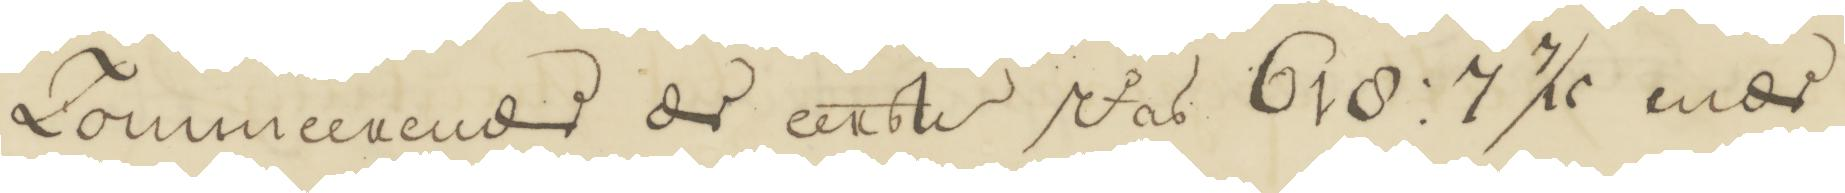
Zommeerende de eerste r o/as 618: 7 7/15 ende
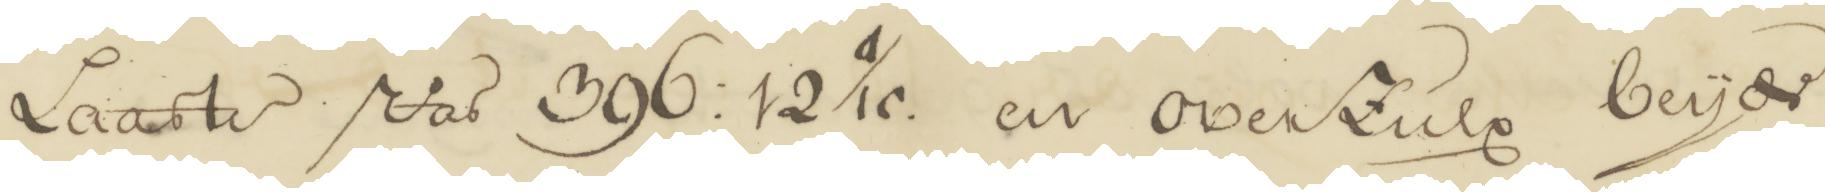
Laaste: r o/as 396: 12 4/15. en over Zulx beijde
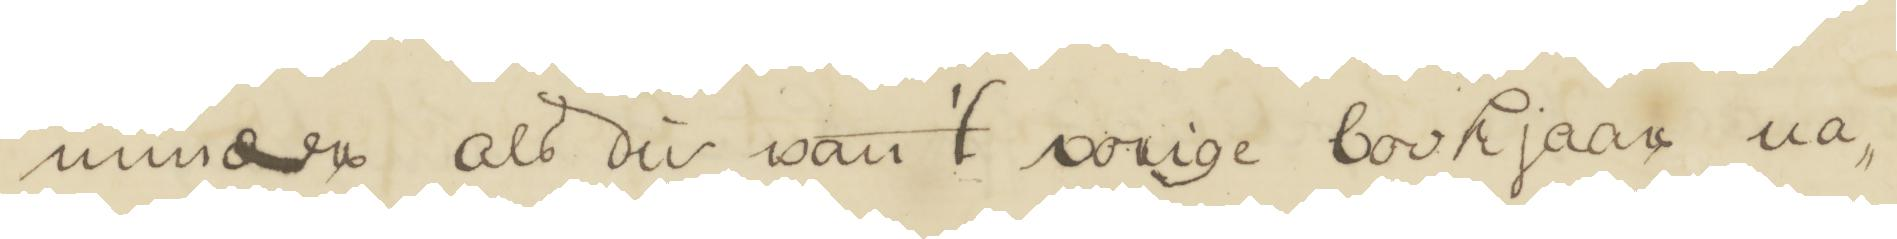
minder als die van ’t vorige boekjaar na„
